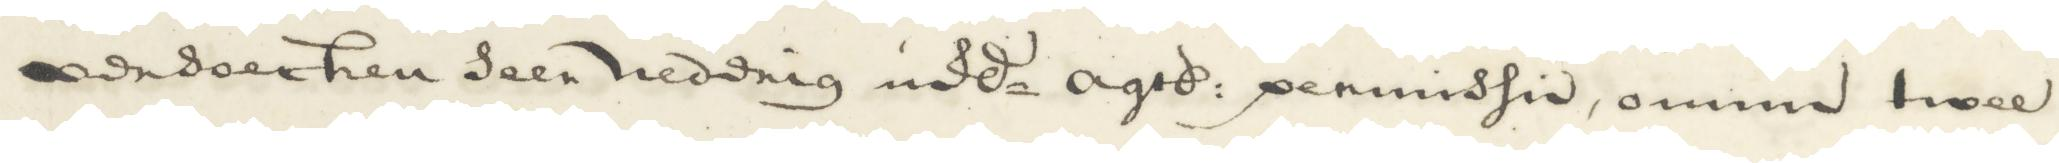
versoecken seer nederig u Ed=' agtb: permissie, omme twee
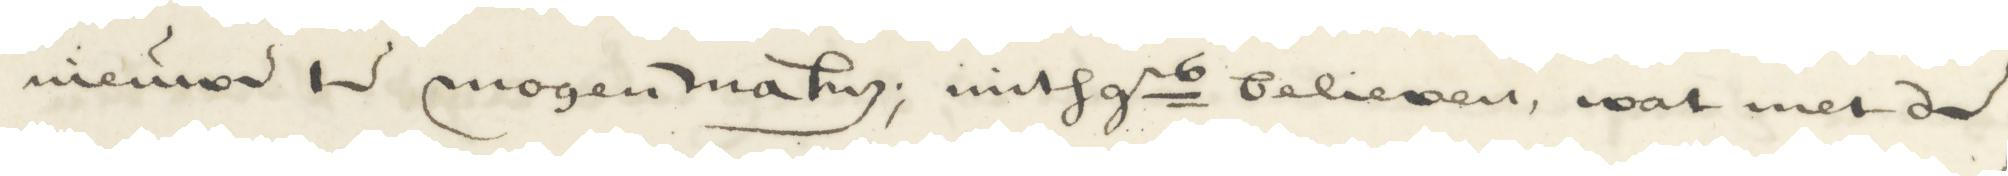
nieuwe te mogen maken; mitsg=rs believen, wat met de
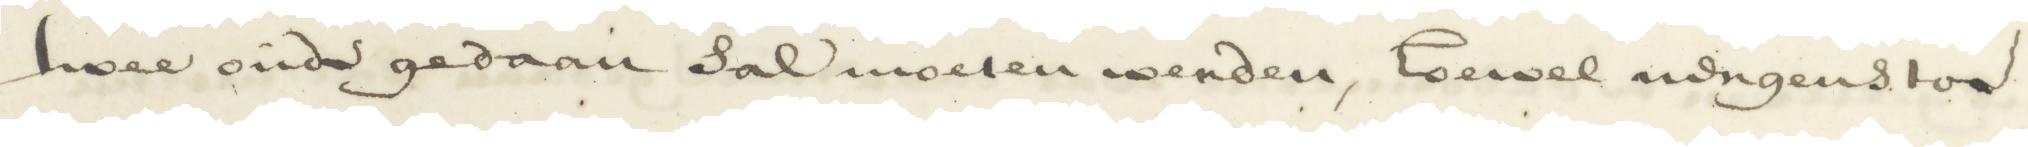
twee oude gedaan sal moeten werden, hoewel nergens toe
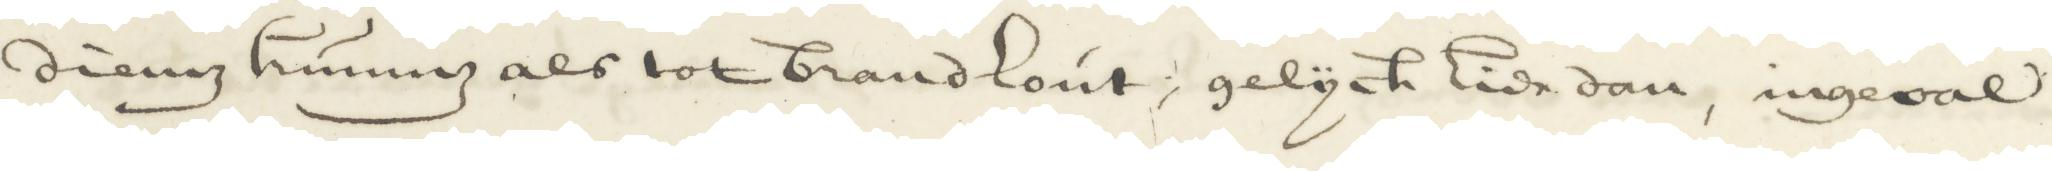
dienen kunnen als tot brandhout; gelijck hier dan, ingeval
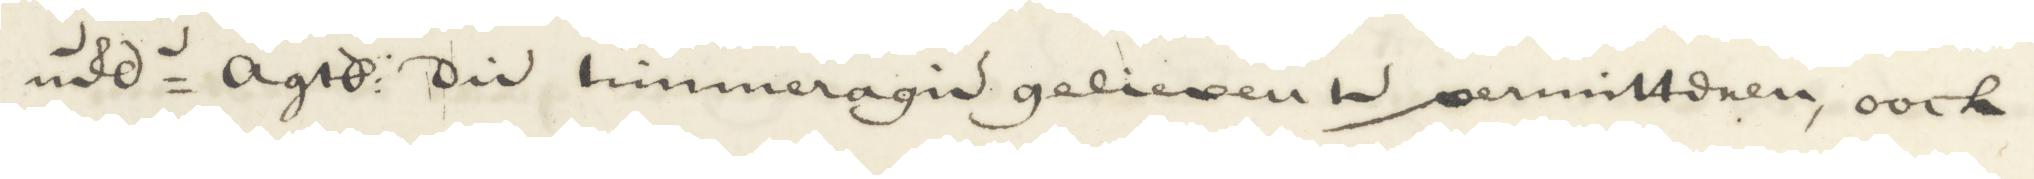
u Ed=e agtb: die timmeragie gelieven te permitteren, oock
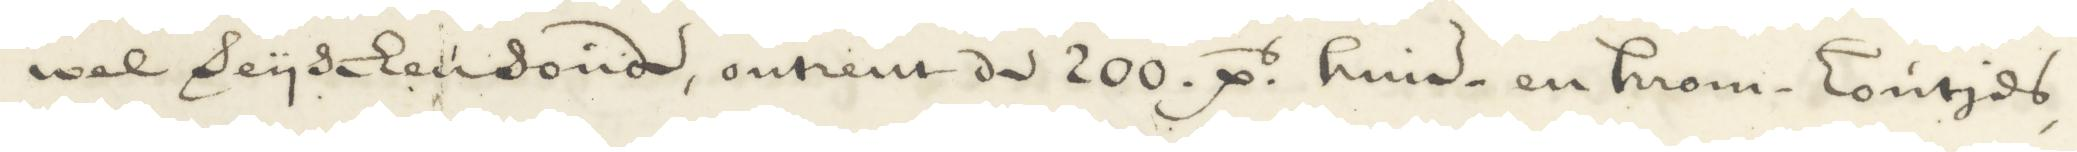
wel vereijschen soude, ontrent de 200. p.s knie- en krom- houtjes,
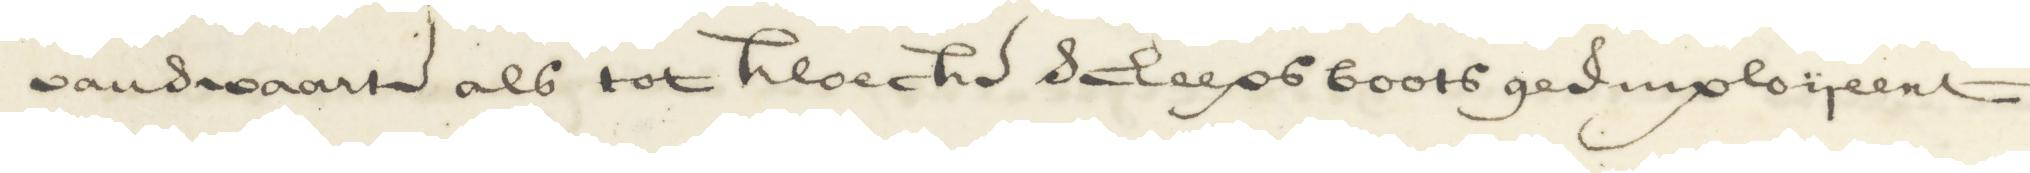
van swaarte als tot kloecke scheeps boots geEmploijeert
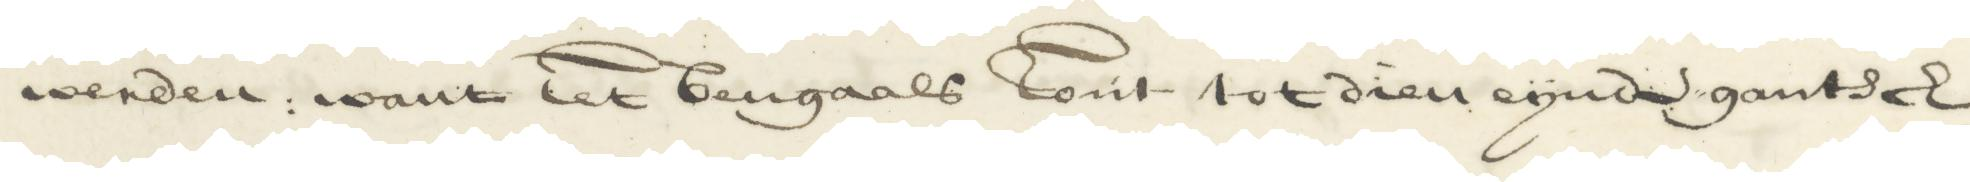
werden: want het bengaals hout tot dien eijnde gantsch
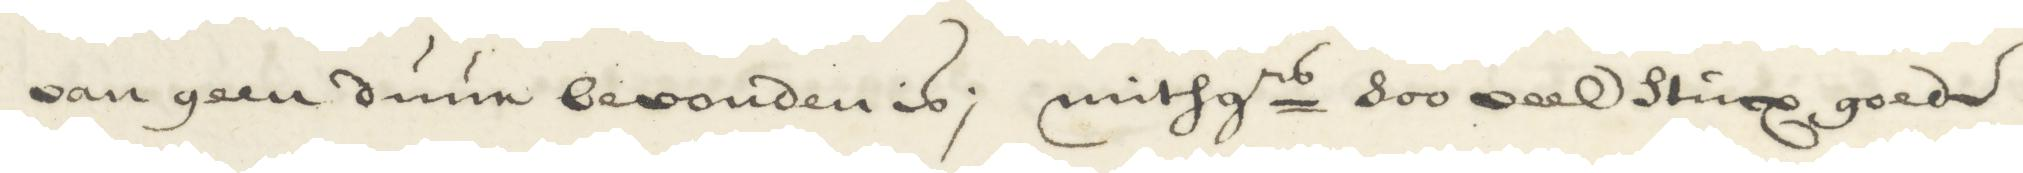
van geen duur bevonden is; mitsg=rs soo veel stucx goede
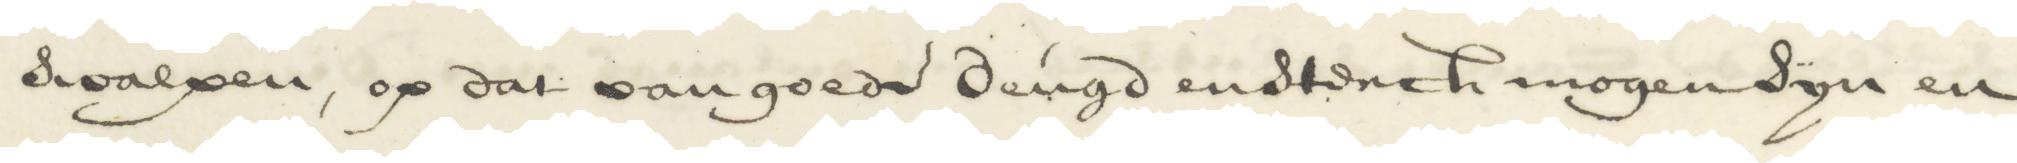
swalpen, op dat van goede deugd en sterck mogen sijn en
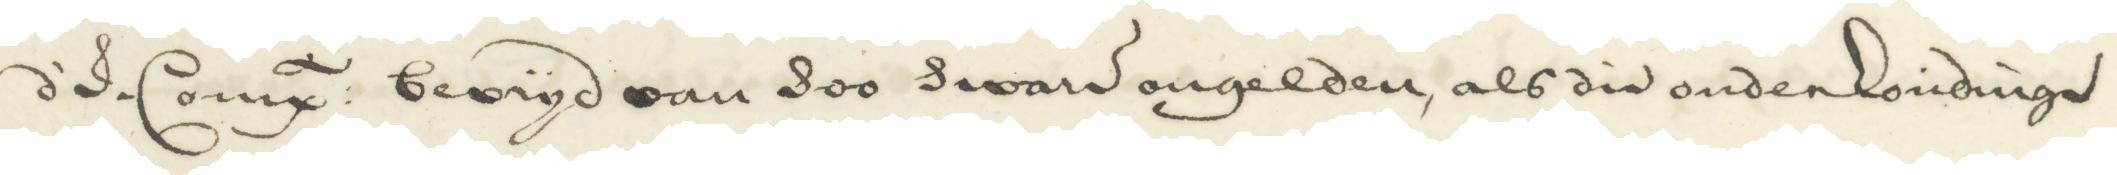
d’E. Comp: bevrijd van soo sware ongelden, als die onder houdinge
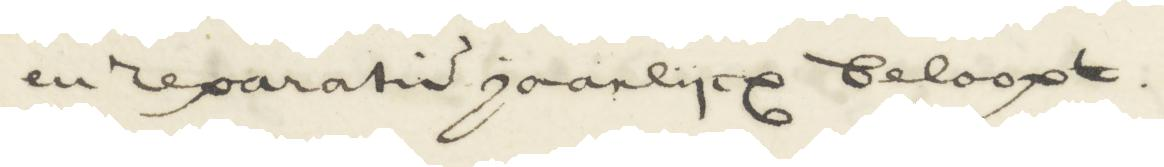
en reparatie jaarlijcx beloopt.
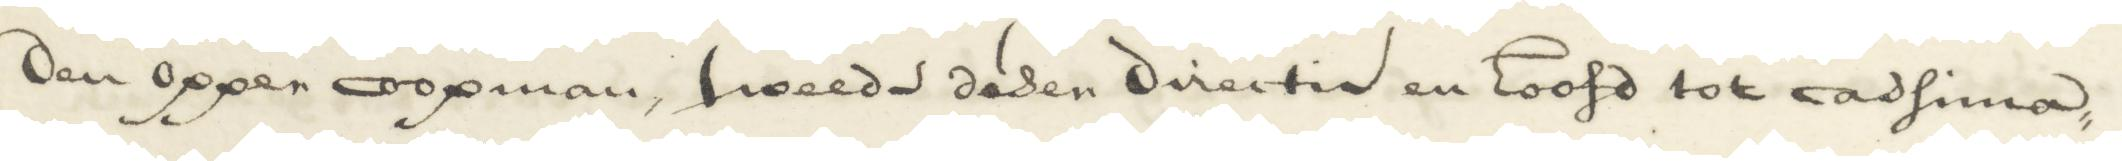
den opper coopman, tweede desen directie en hoofd tot cassima„
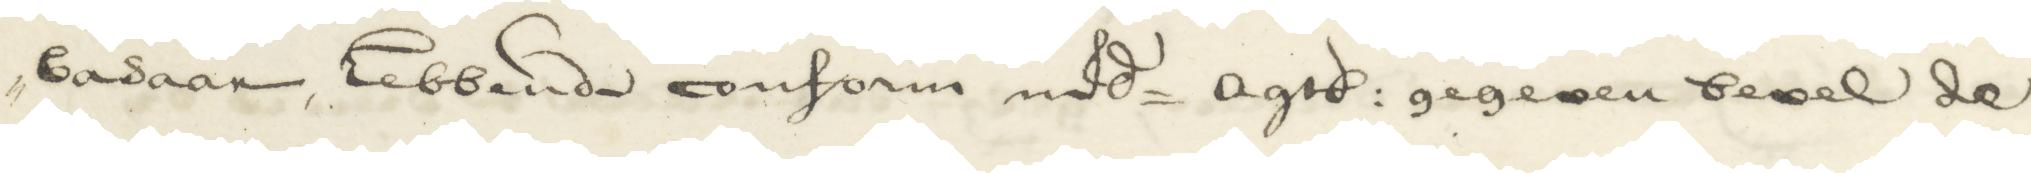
basaar, hebbende conform uEd= agtb: gegeven bevel de
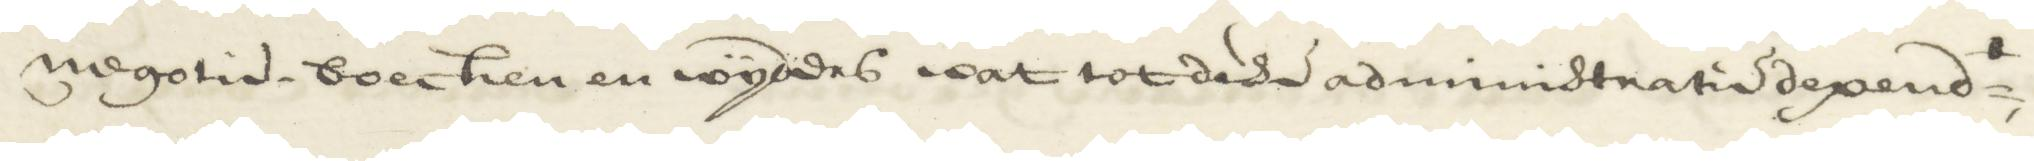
negotie-boecken en wijders wat tot dese administratie depend=t,
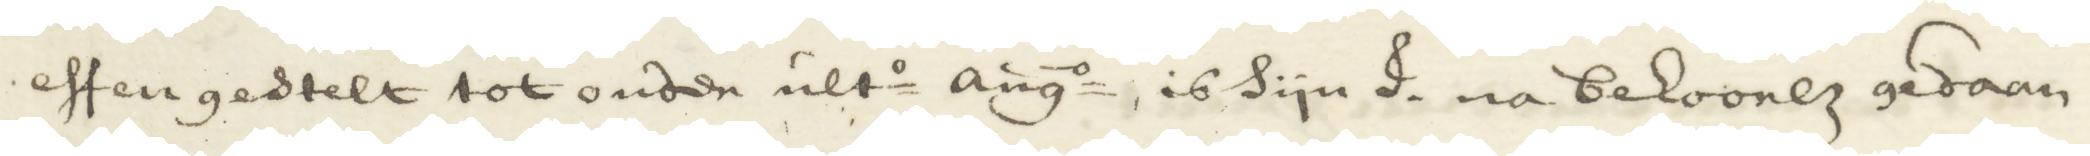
effen gestelt tot onder ult=o aug=o, is sijn E. na behoorlijk gedaan
